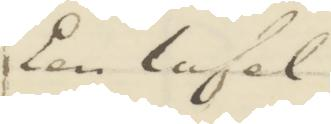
Een tafel
